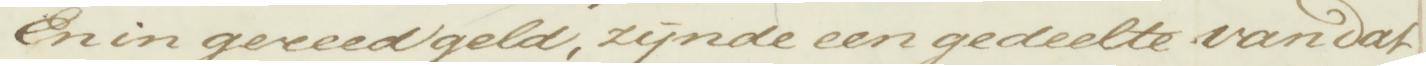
En in gereed geld, zijnde een gedeelte van dat
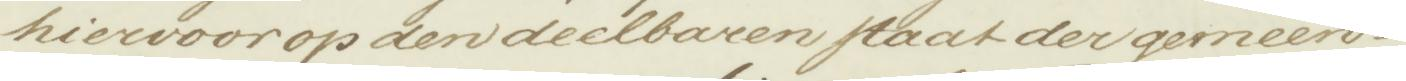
hiervoor op den deelbaren staat der gemeen-
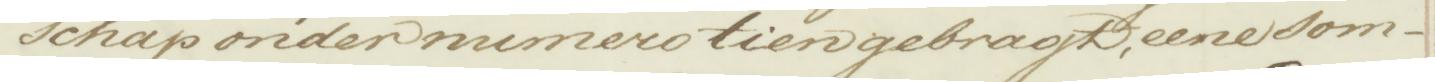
schap onder numero tien gebragt, eene som-
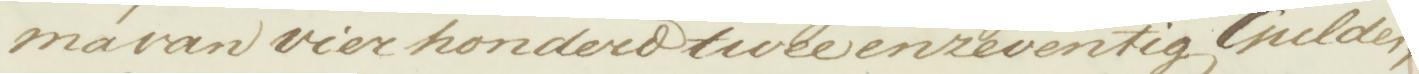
ma van vier honderd twee en zeventig Gulden
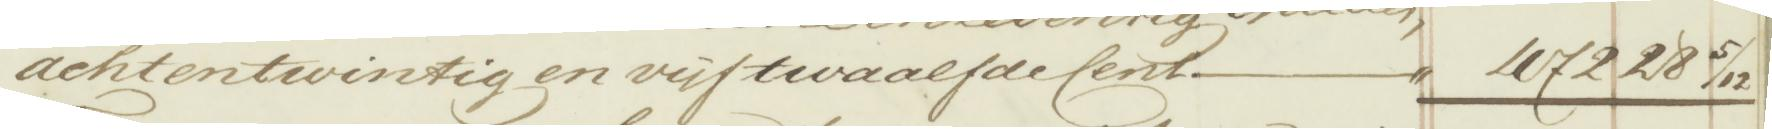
acht en twintig en vijf twaalfde Cent „ 472 28 5/12
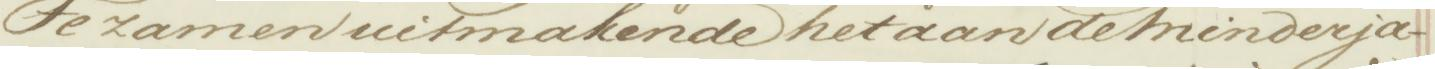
Te zamen uitmakende het aan de minderja-
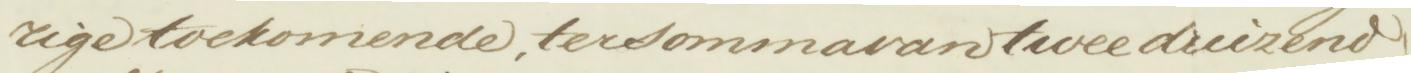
rige toekomende, ter somma van twee duizend
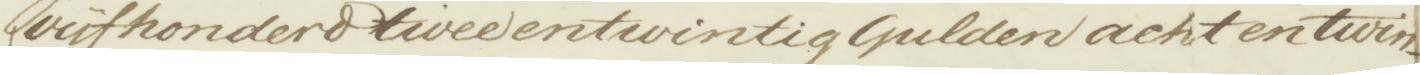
vijfhonderd twee en twintig Gulden acht en twin
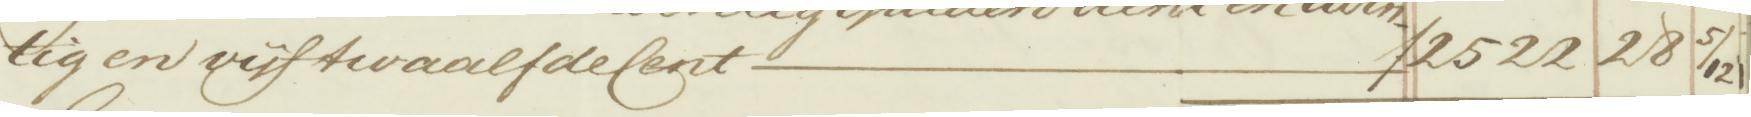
tig en vijf twaalfde Cent ƒ2522 28 5/12
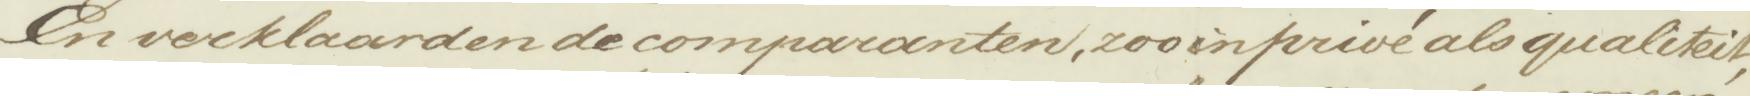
En verklaarden de comparanten, zoo in privé als qualiteit,
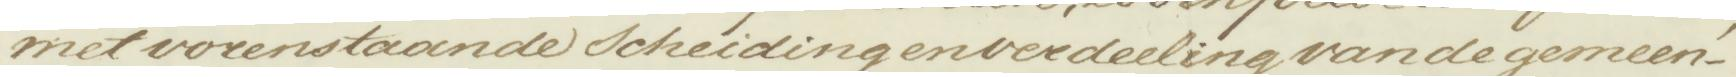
met vorenstaande scheiding en verdeeling van de gemeen
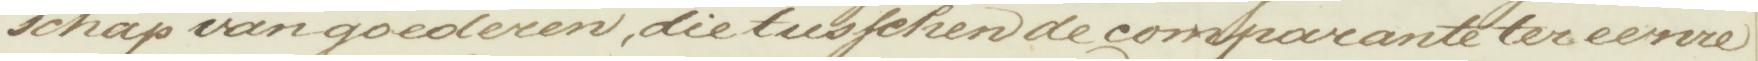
schap van goederen, die tusschen de comparante ter eenre
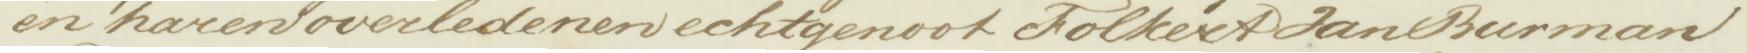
en haren overledenen echtgenoot Folkert Jan Burman
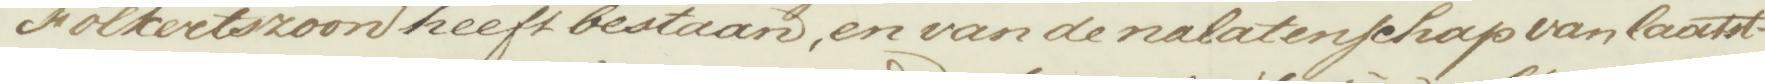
Folkertszoon heeft bestaan, en van de nalatenschap van laatst-
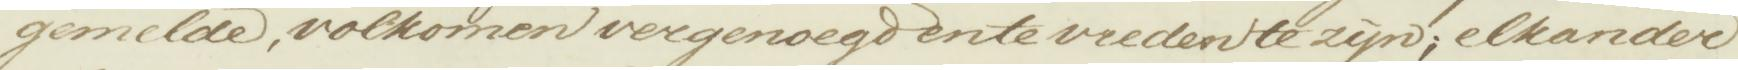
gemelde, volkomen vergenoegd en te vreden te zijn; elkander
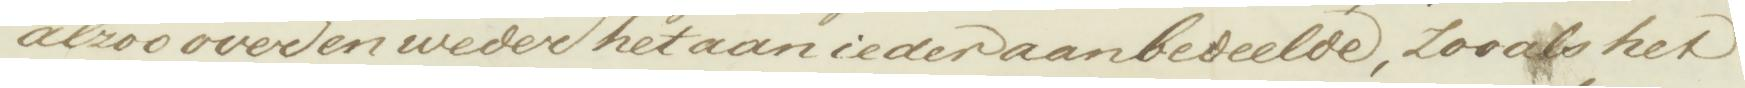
alzoo over en weder het aan ieder aanbedeelde, zooals het
